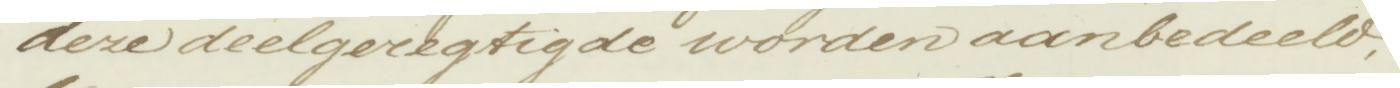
deze deelgeregtigde worden aanbedeeld,
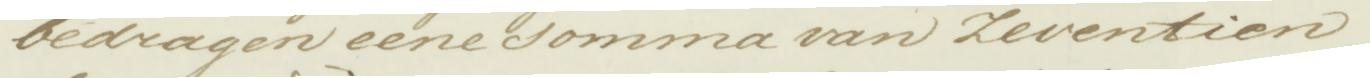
bedragen eene somma van zeventien
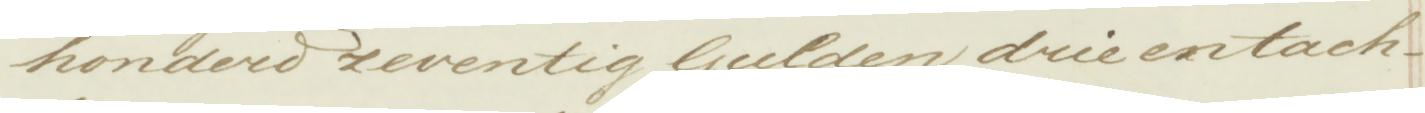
honderd zeventig Gulden drie en tach_
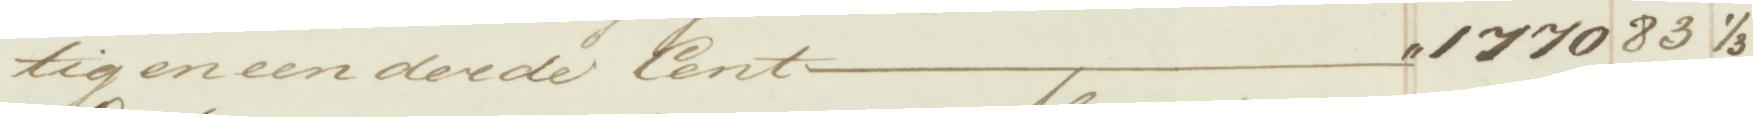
tig en een derde Cent „1770 83 1/3
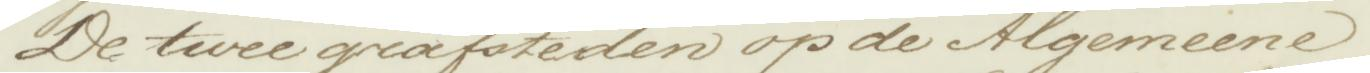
De twee grafsteden op de Algemeene
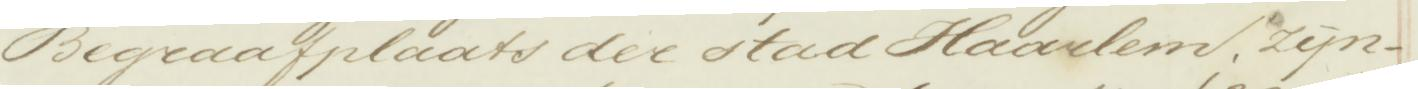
Begraafplaats der stad Haarlem, zijn-
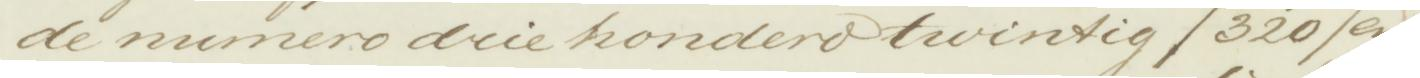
de numero drie honderd twintig /320/ en
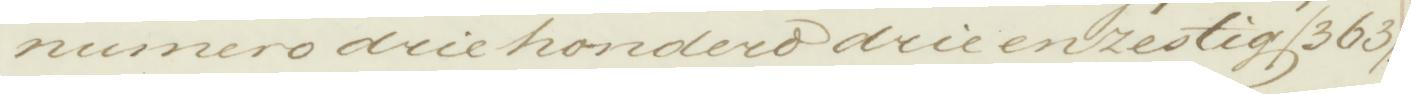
numero drie honderd drie en zestig /363/
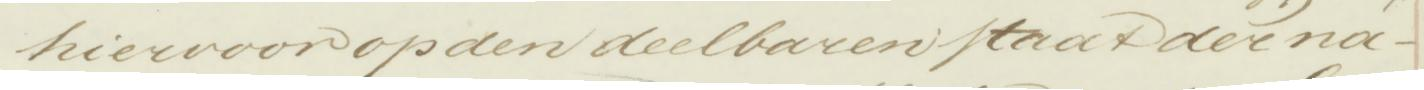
hiervoor op den deelbaren staat der na-
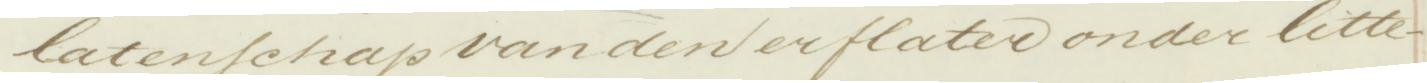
latenschap van den erflater onder litte-
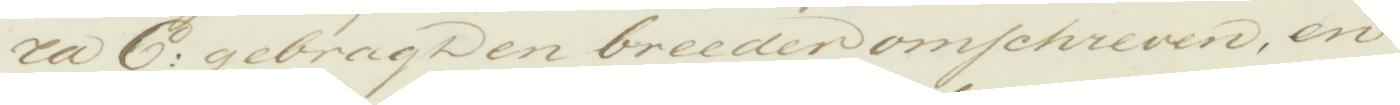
ra C: gebragt en breeder omschreven, en
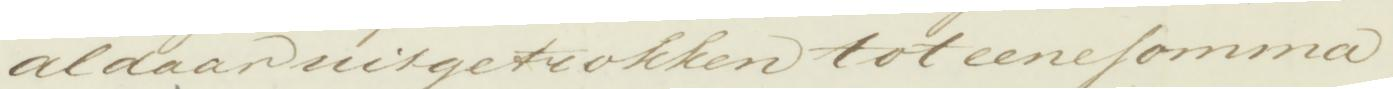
aldaar uitgetrokken tot eene somma
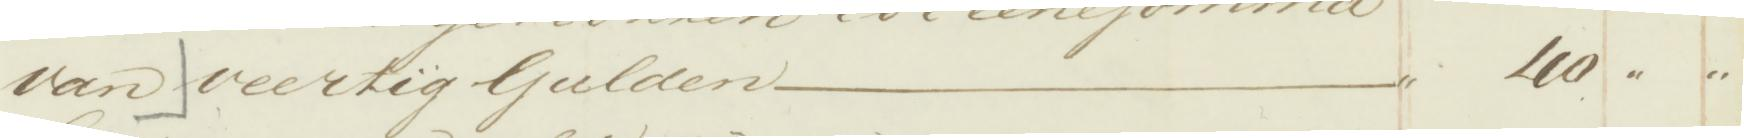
van | veertig Gulden „ 40 „ „
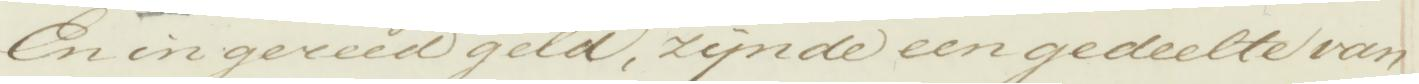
En ingereed geld, zijnde een gedeelte van
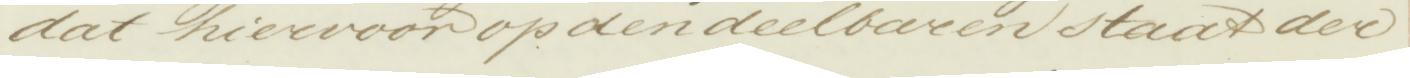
dat hiervoor op den deelbaren staat der
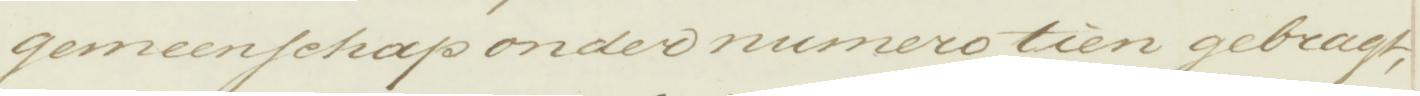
gemeenschap onder numero tien gebragt,
